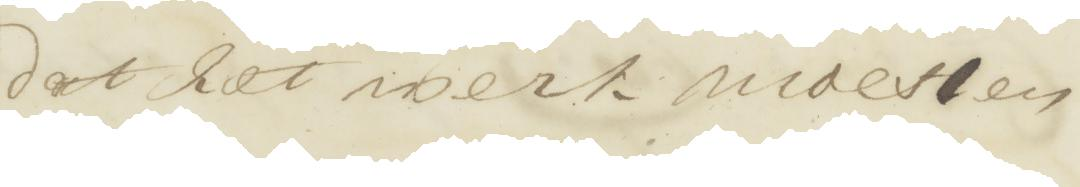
dat het werk moesten
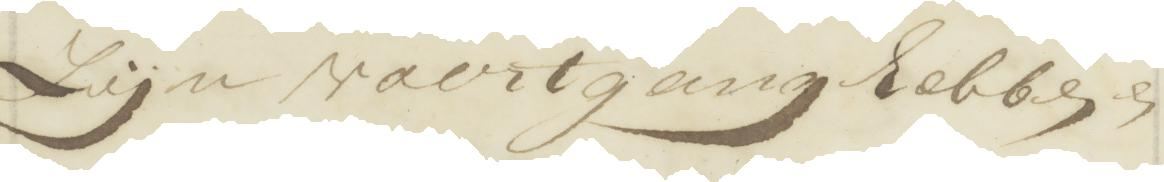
zijn voortgang hebben en
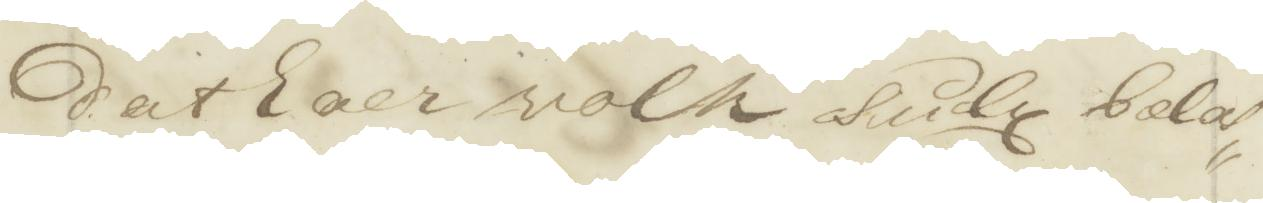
dat haer volk sulx belas„
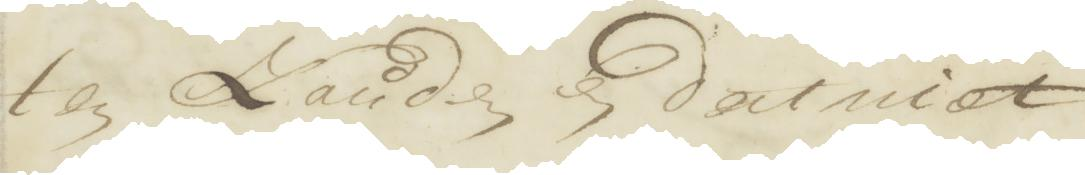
ten zouden en dat niet
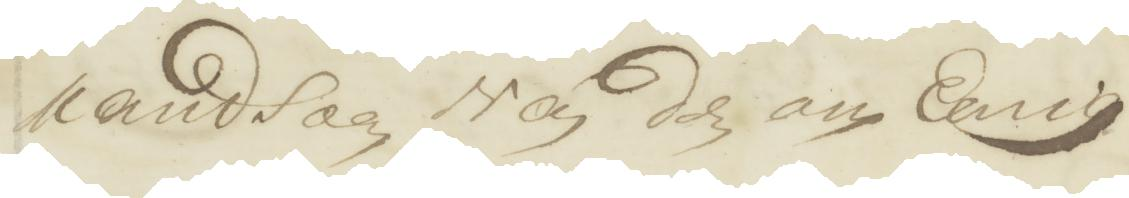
randsoen van den on Eenig
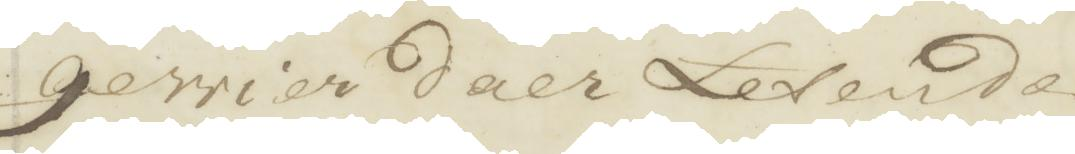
gewier daer tesenden
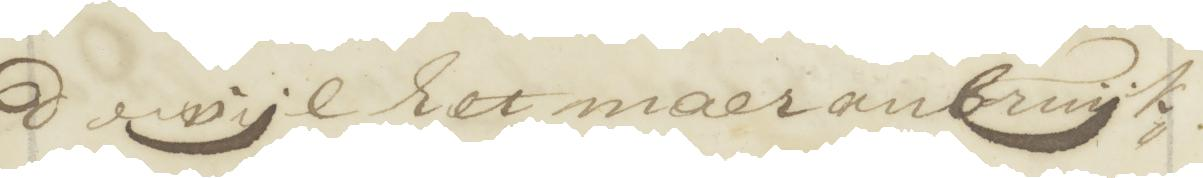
dewijl het maer onbruijk
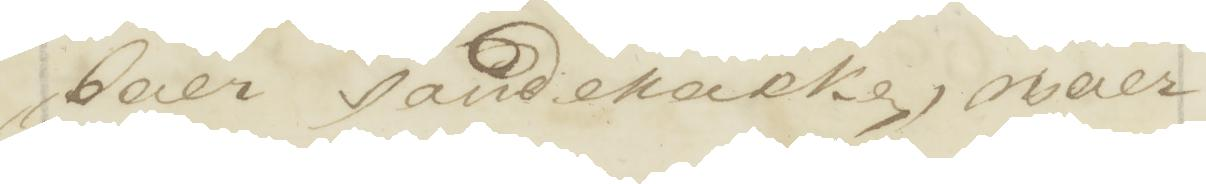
„baer soude raeken, waer
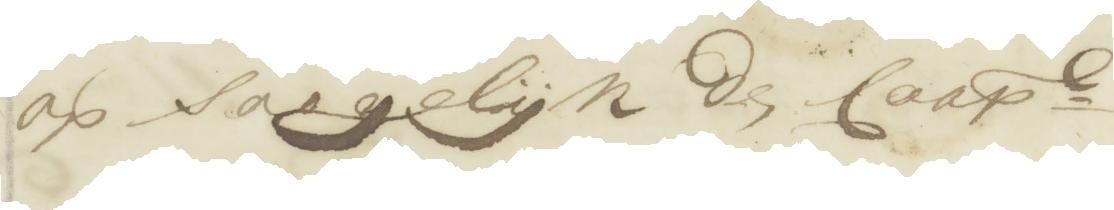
op soogelijk den Corp=l
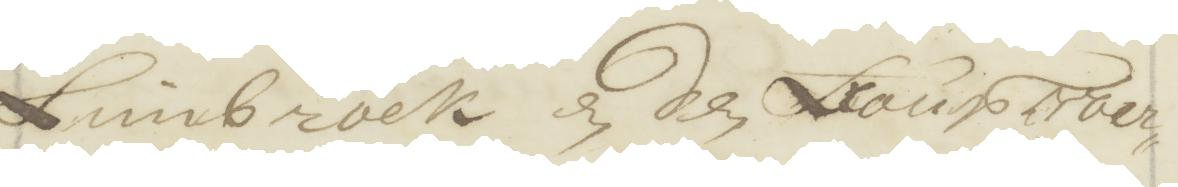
Limbroek en den Troupvoer„
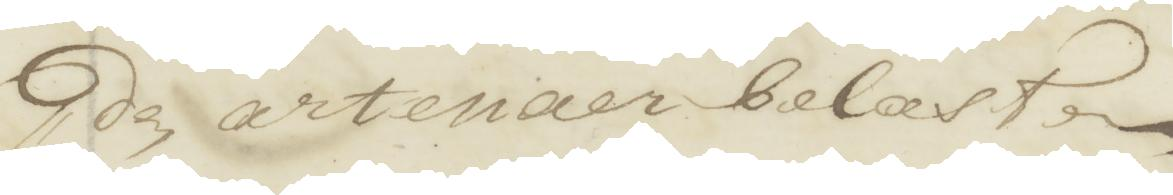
„der artenaer belasten
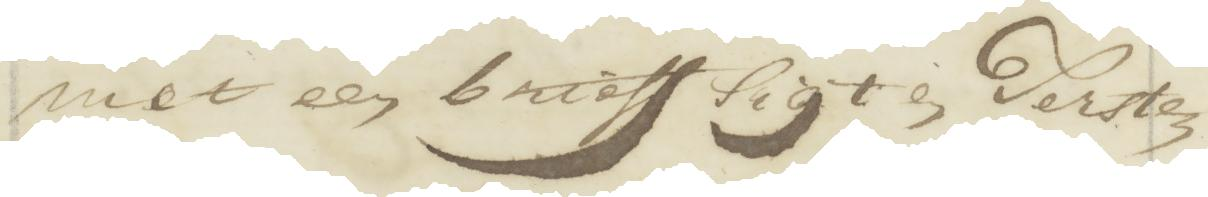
met een brieff sig ten Eersten
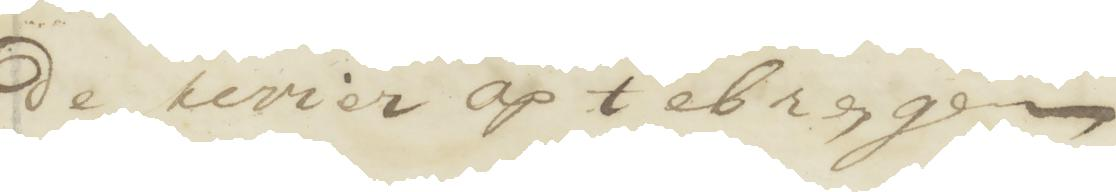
de revier op tebrengen,
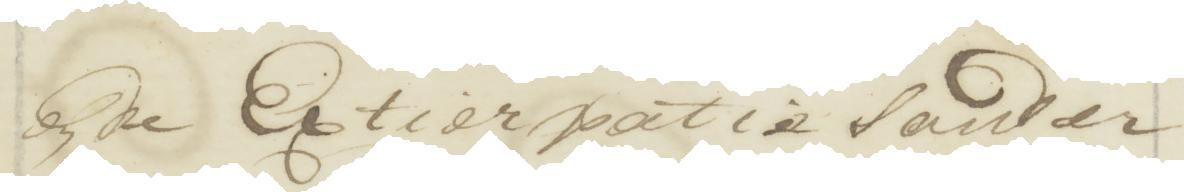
en de Extierpatie sonder
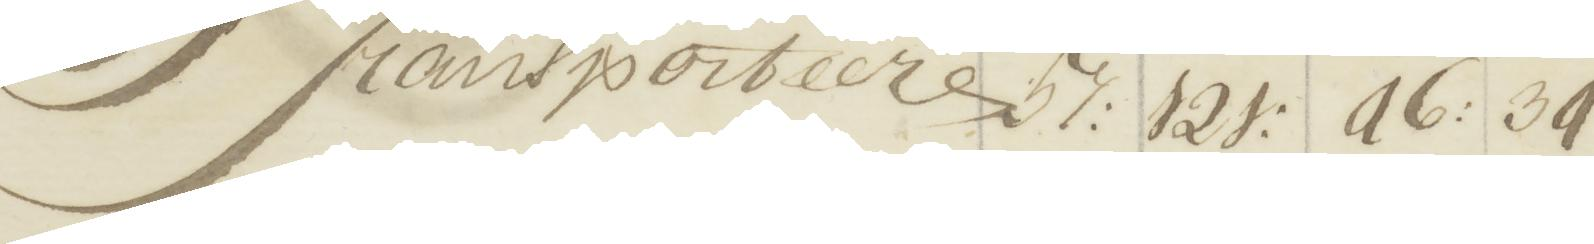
Transporteere 57: 121: 46: 34
